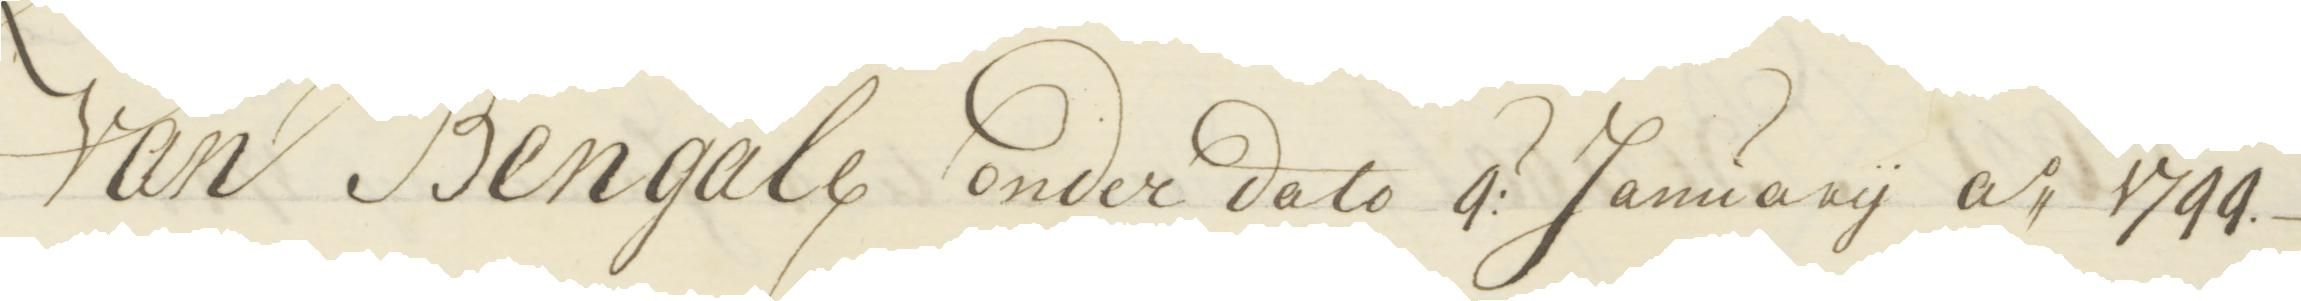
Van Bengale onder dato 4:en Januarij a„o 1744.
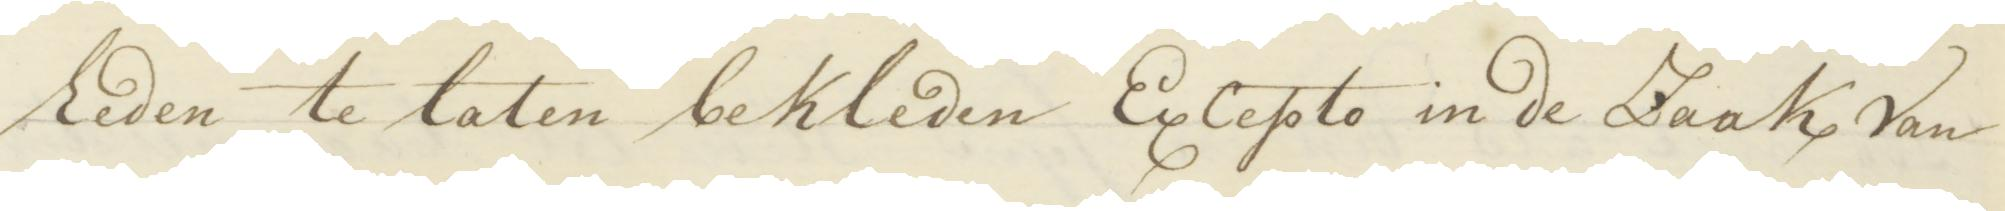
heden te laten bekleden Excepto in de Zaak Van
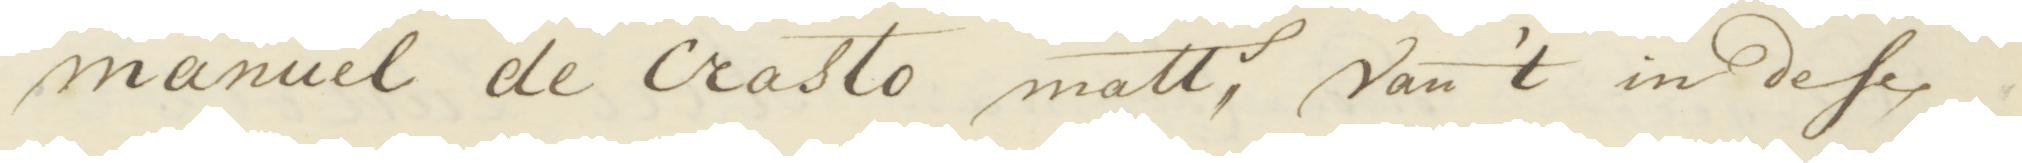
manuel de Crasto matt„s van ’t in dese
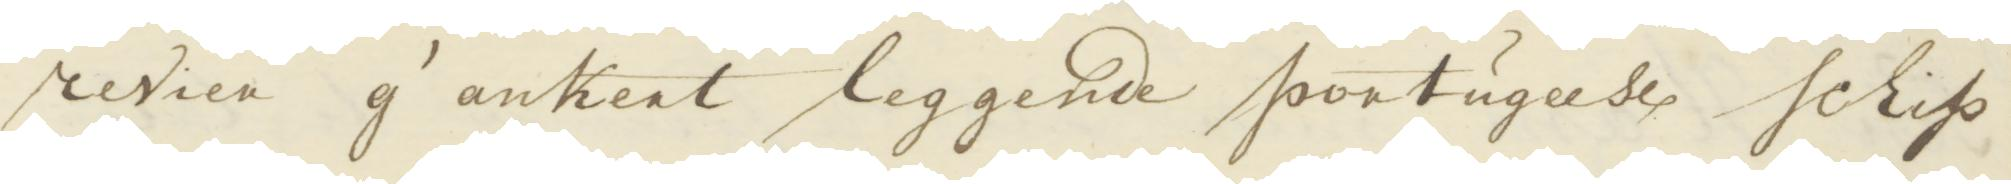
revier g’ ankert leggende portugeese Schip
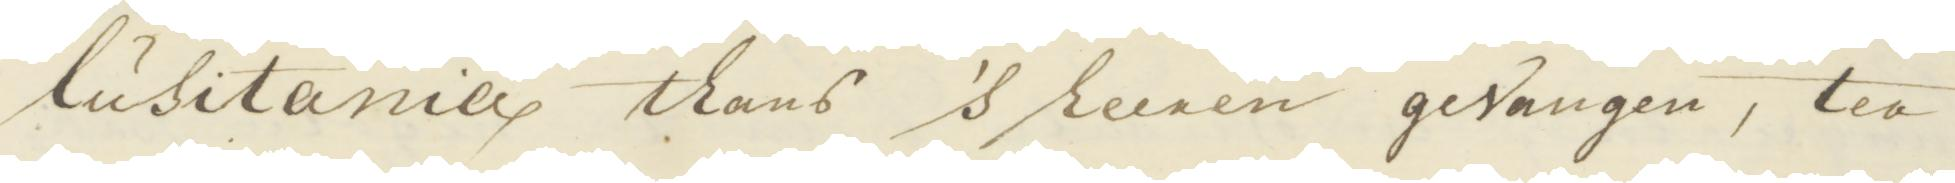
lusitania thans ’s heeren gevangen, ter
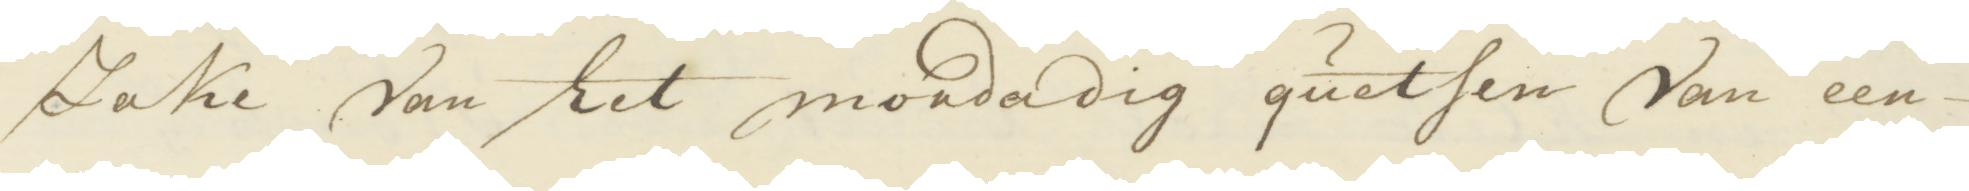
Zake van het mordadig quetsen Van een
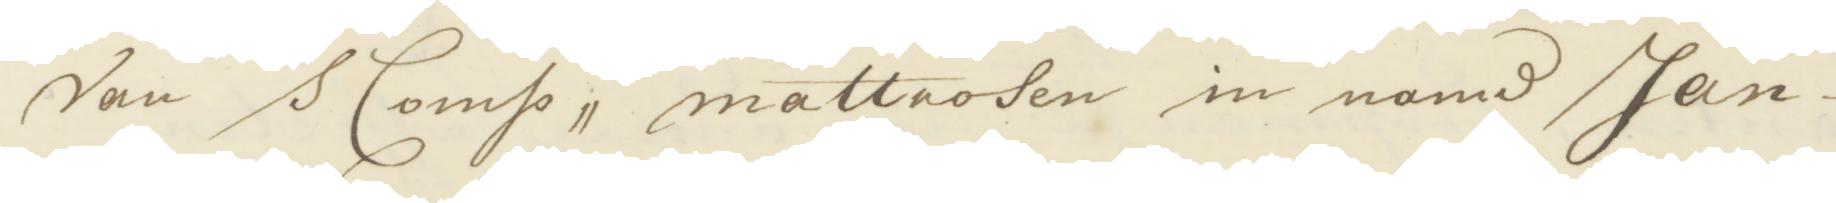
van 'S Comp„s mattrosen in name Jan
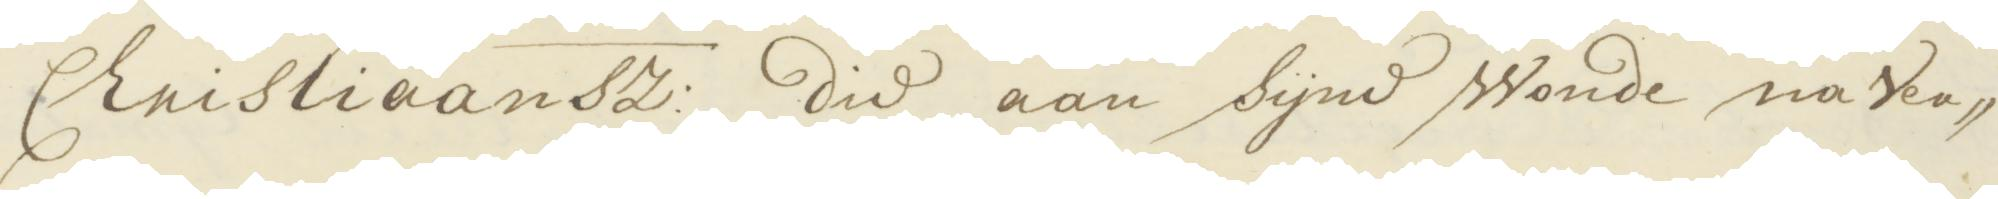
Christiaansz: die aan Sijne Wonde na Ver„
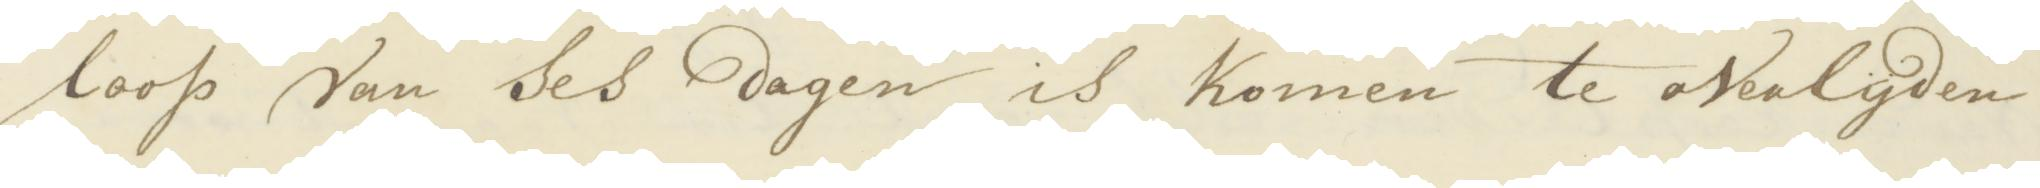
loop van Ses dagen is komen te overlijden
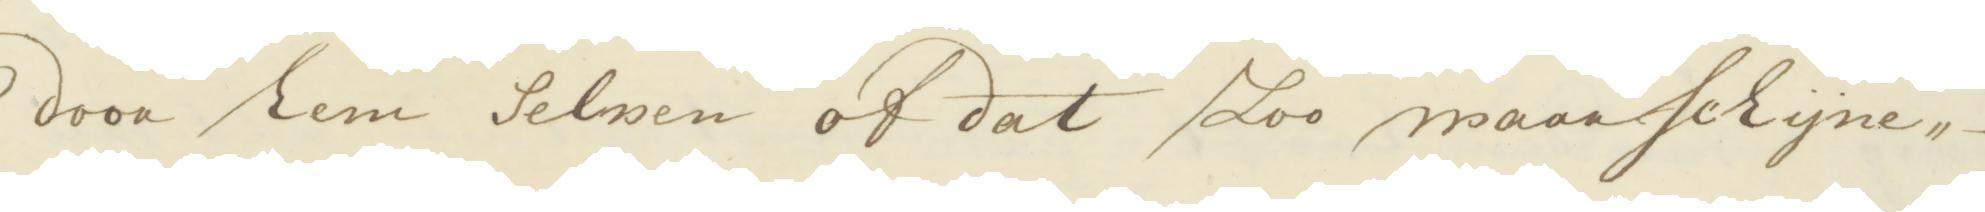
door hem selven of dat Zoo waarschijne„
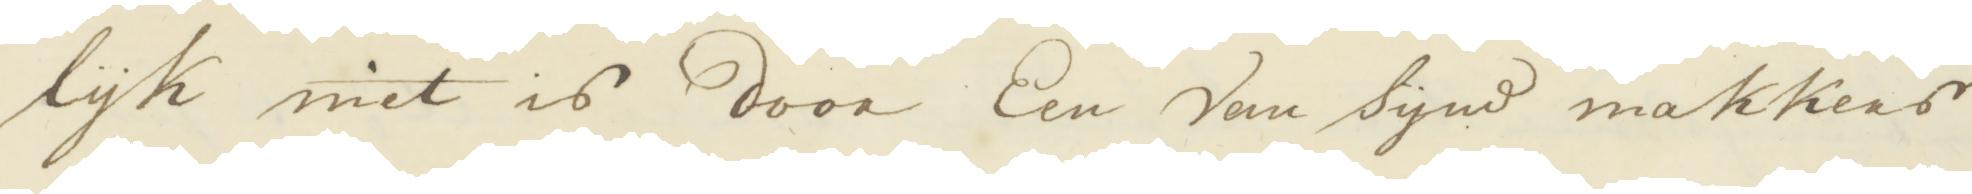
lijk niet is door Een Van Sijne makkers
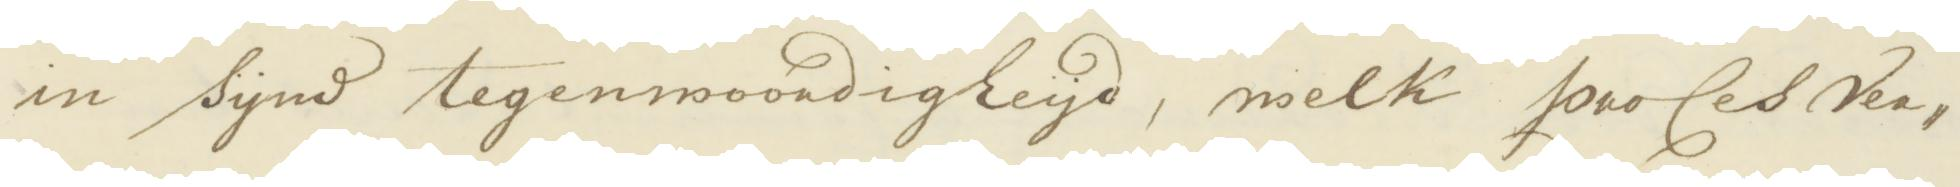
in sijne tegenwoordigheijd, welk proces Ver„
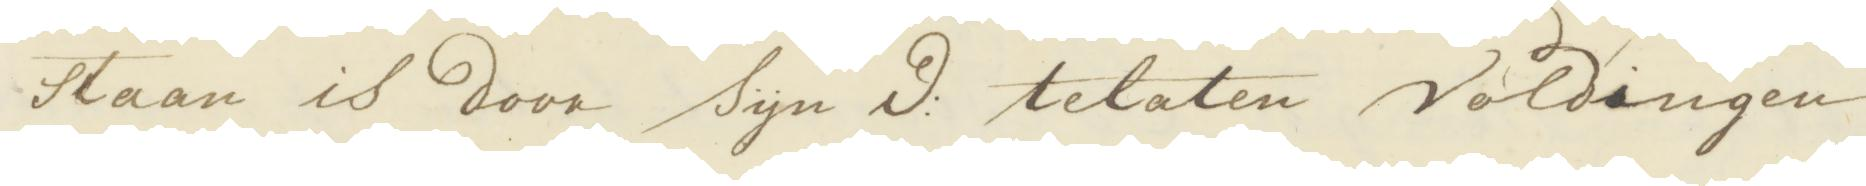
staan is door Sijn E: te laten Voldingen,
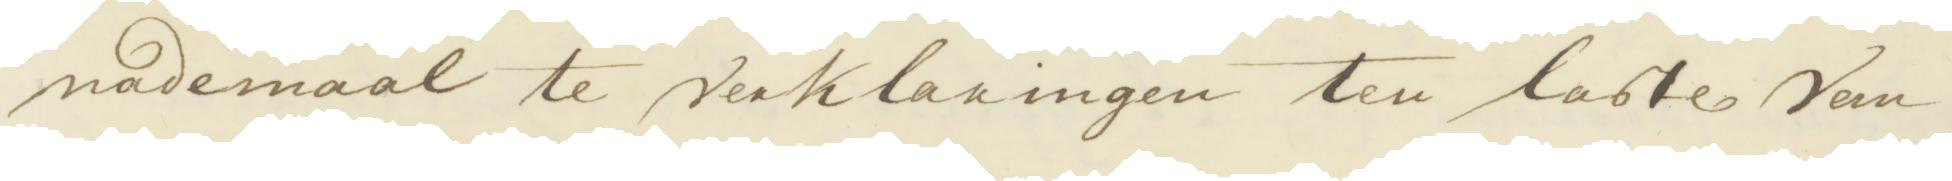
nademaal te verklaringen ten laste Van
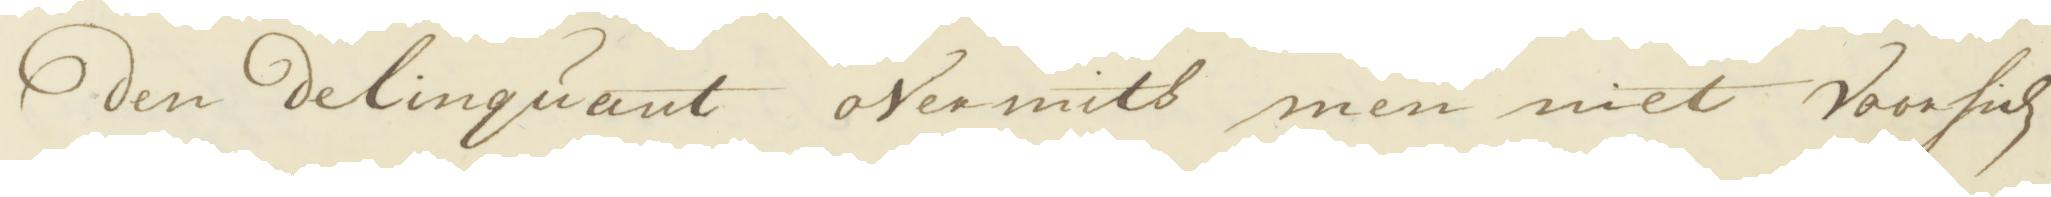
den delinquant overmits men niet Voorsien
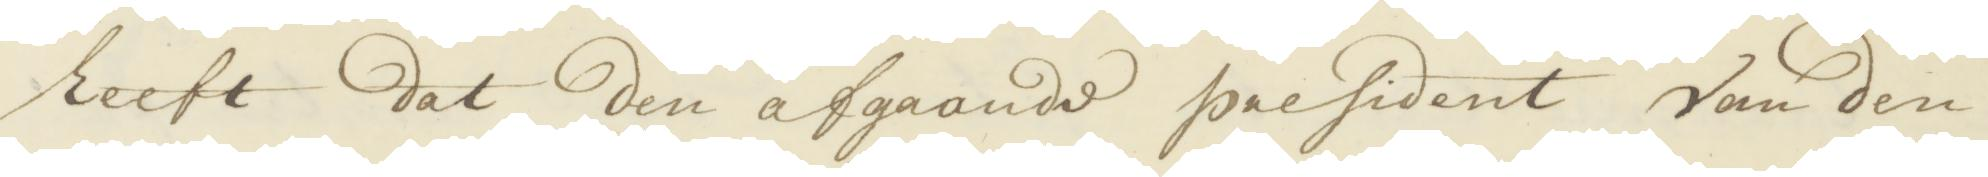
heeft dat den afgaande president Van den
